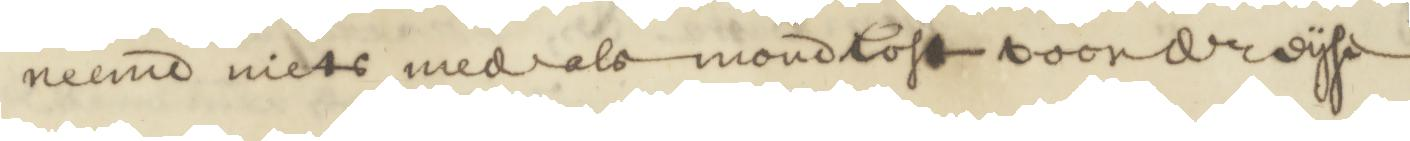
neemd niets mede als mondkost voor dereijse
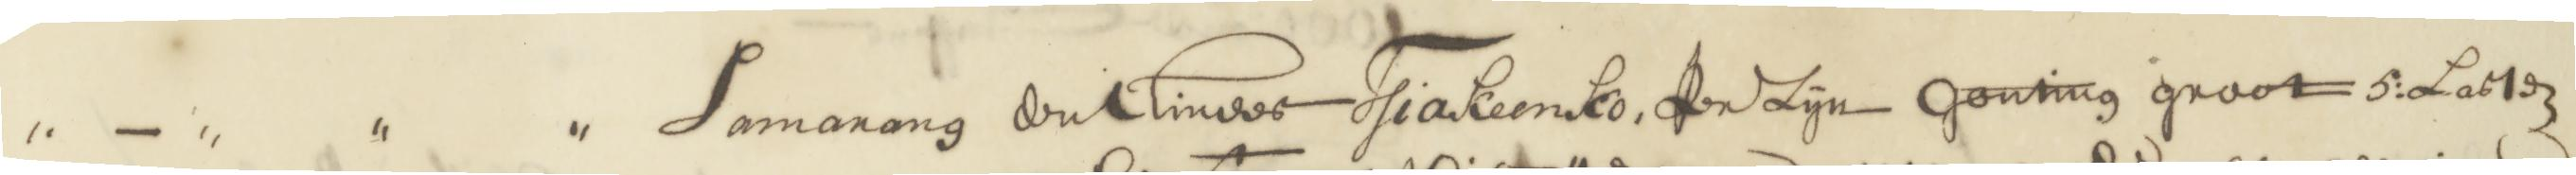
„ — „ „ „ Samarang den chinees Tsiakeenko, per zijn gonting groot 5: lasten
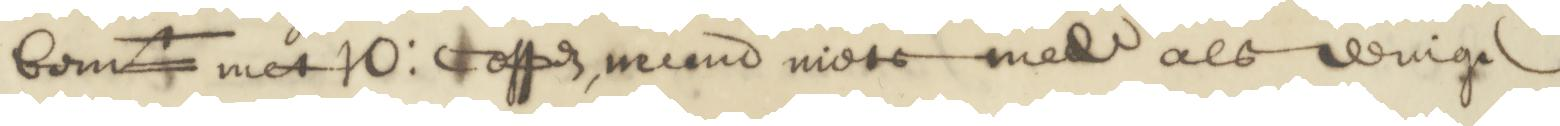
bem=t met 10: coppen, neemd niets mede als eenige
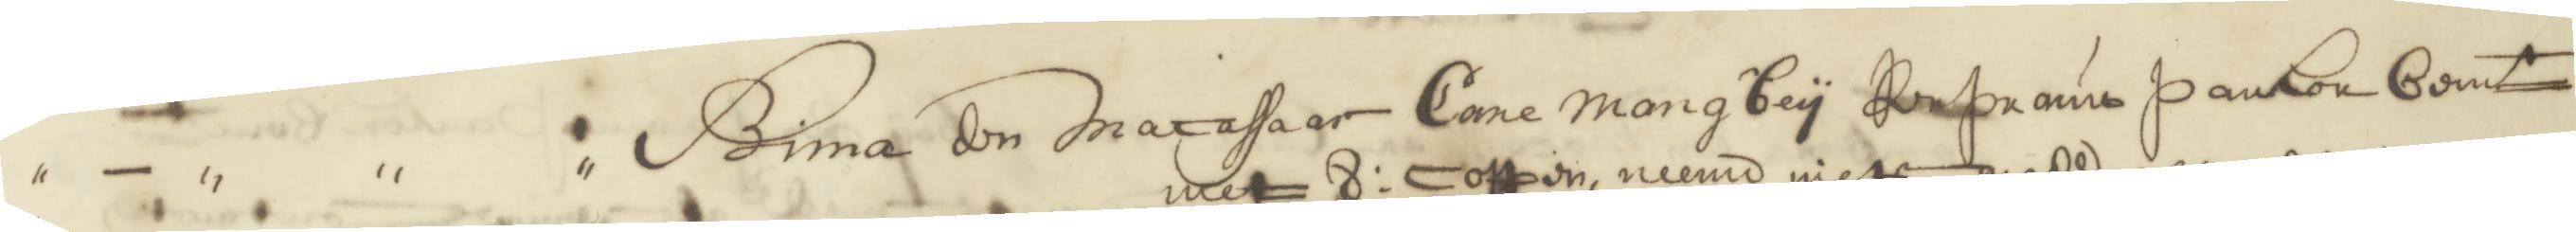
„ — „ „ „ Bima den macassaar Care mangbeij Per prauw pankor bem=t
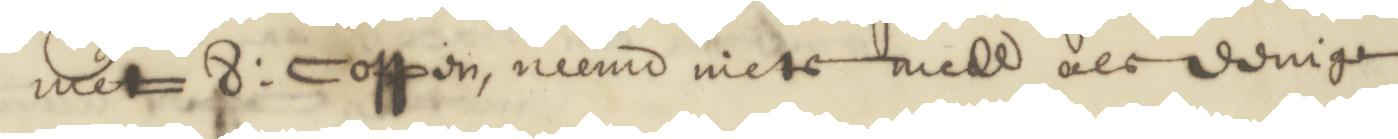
met= 8: coppen, neemd niets mede als eenige
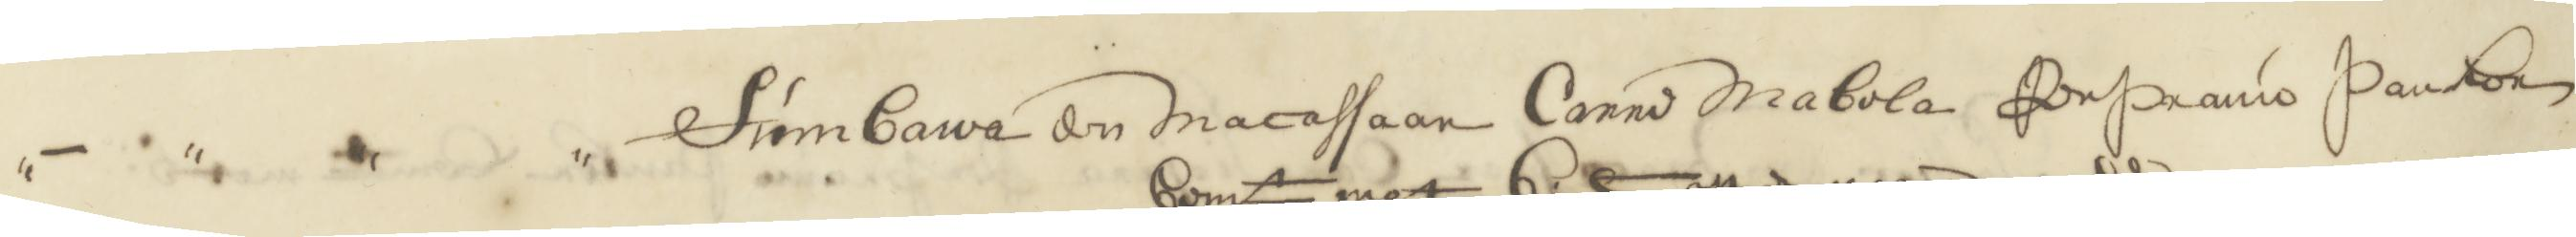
„ —„ „ „ Sumbawa den macassaar Canne Mabola Per prauw pankor
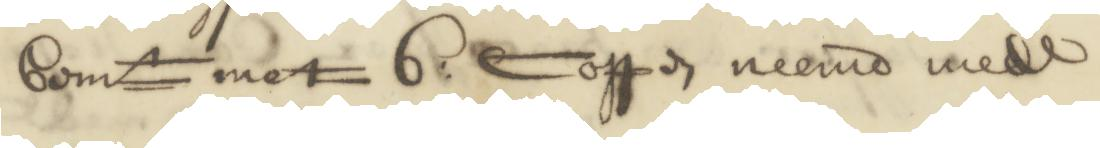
bem=t met 6: Coppen neemd mede
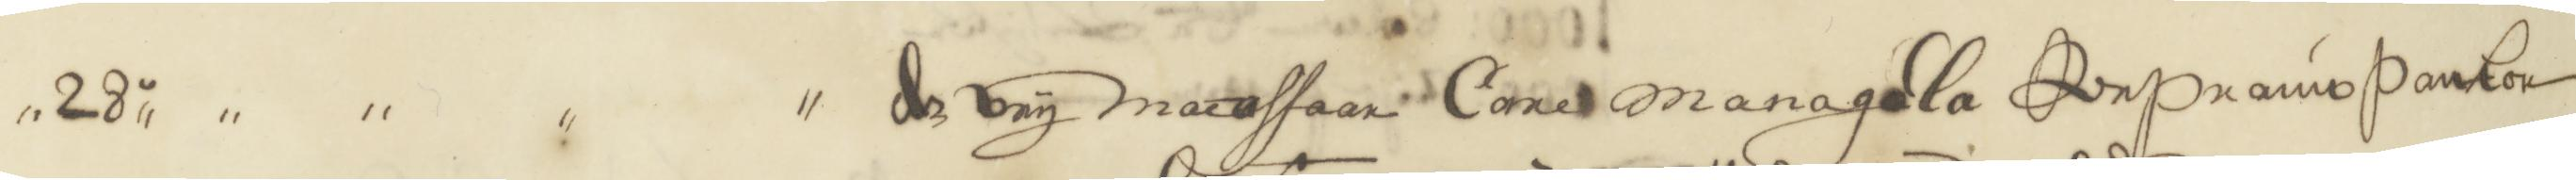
„ 28„' „ „ „ „ den vrij macassaar Care managela Per prauw pankor
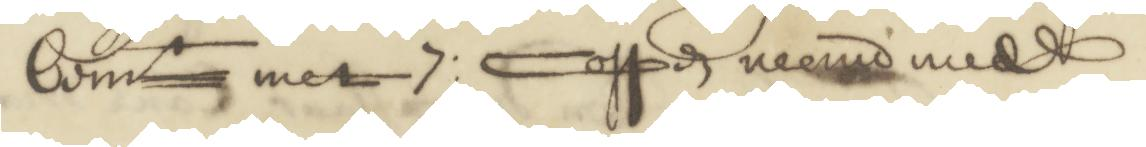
bem=t met 7: coppen neemd mede
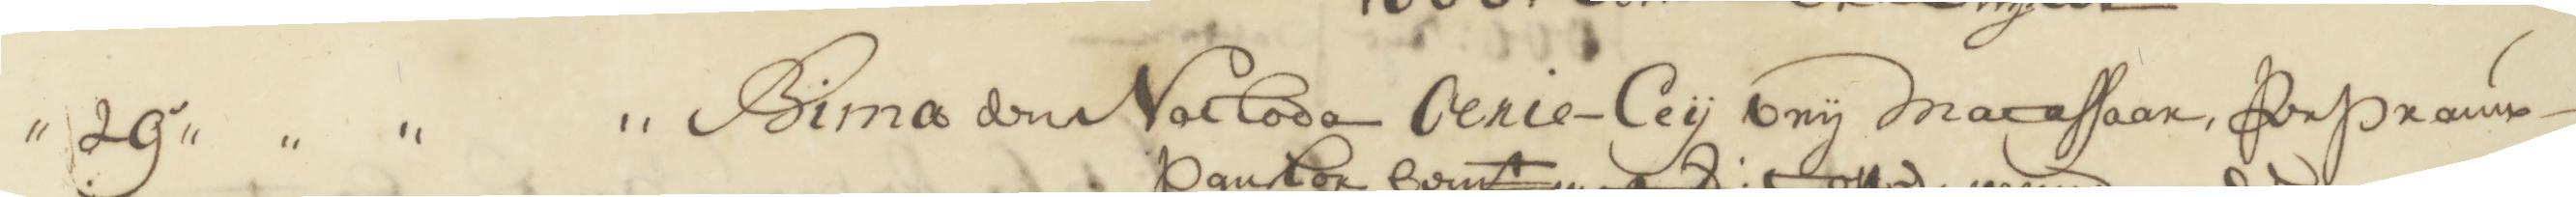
„ 29„' „ „ „ Bima den Nachoda Oerie-Ceij vrij Macassaar, Per prauw
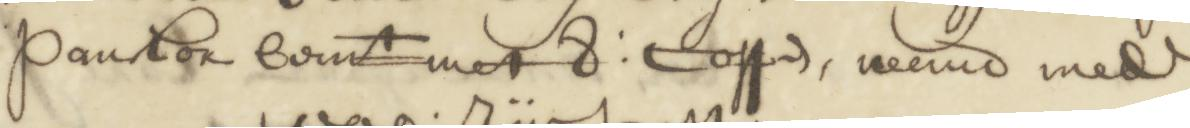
pankor bem=t met 8: coppen, neemd mede
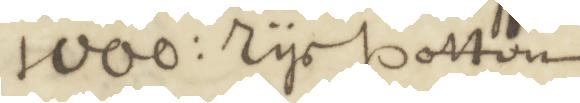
1000: rijs potten
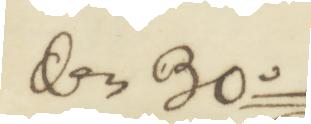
den 30='
